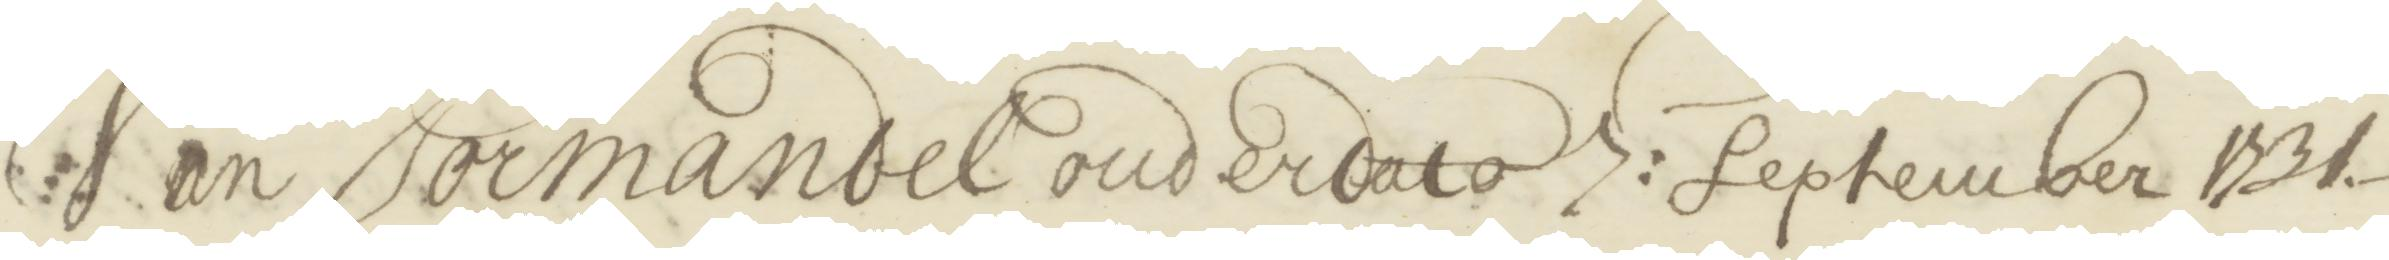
Van Cormandel onder dato 7:' September 1731.
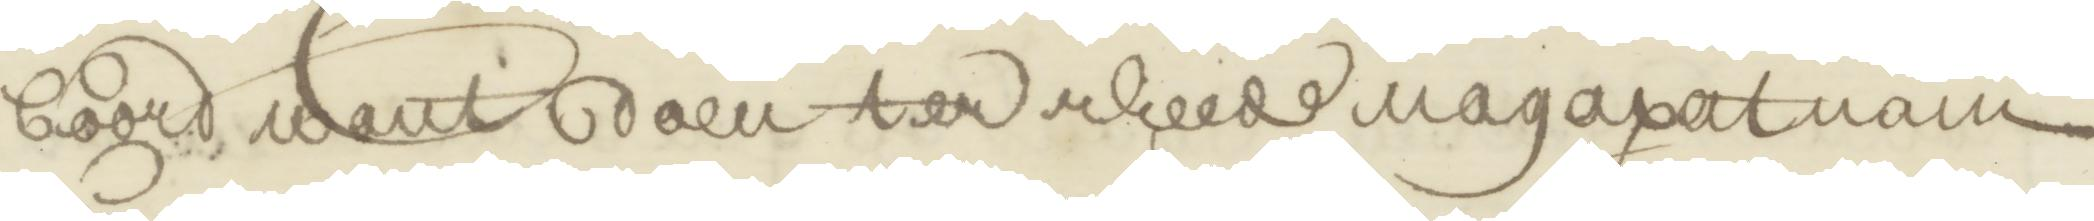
boord want doen ter rheede nagapatnam
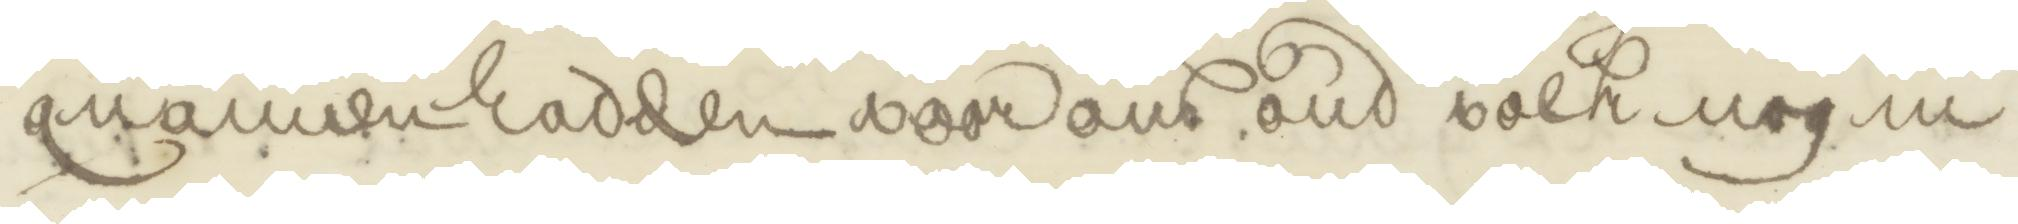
quamen hadden voor ons oud volk nog in
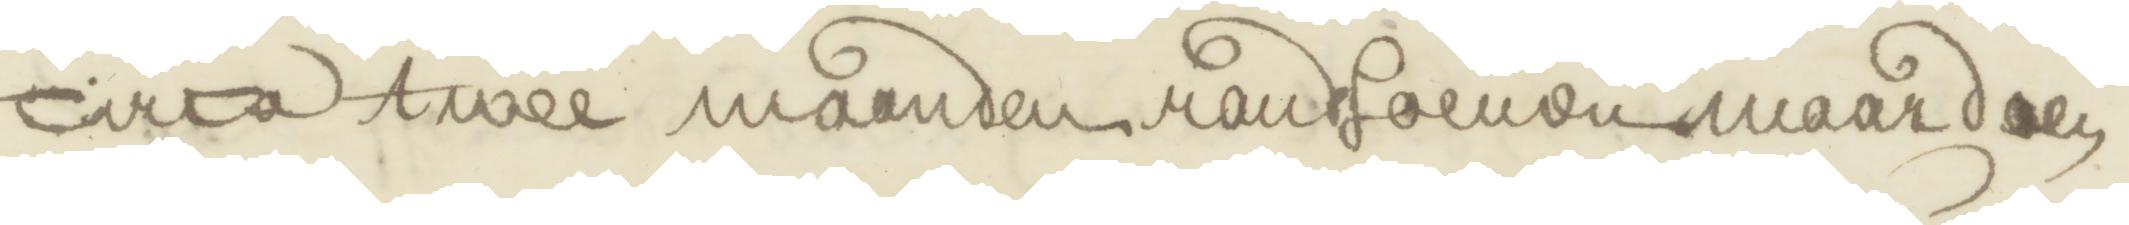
circa twee maanden randsoenen maar doen
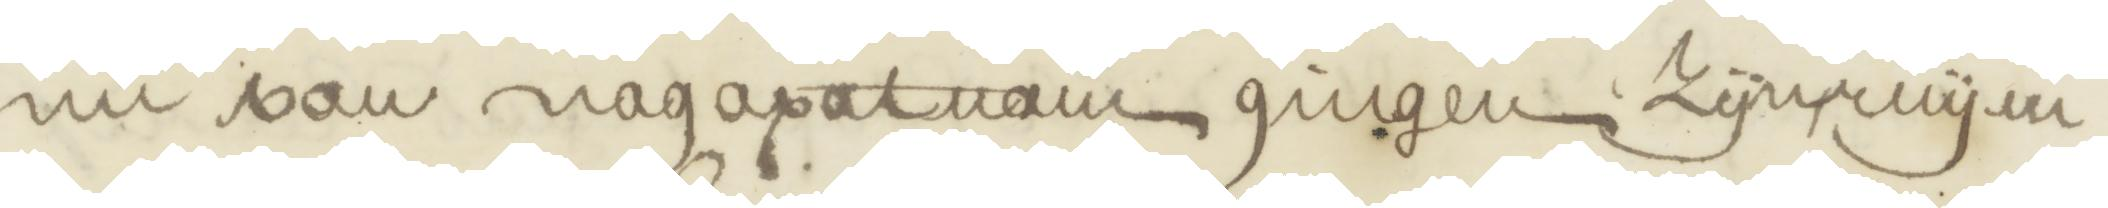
nu van nagapatnam gingen zijn ruijm
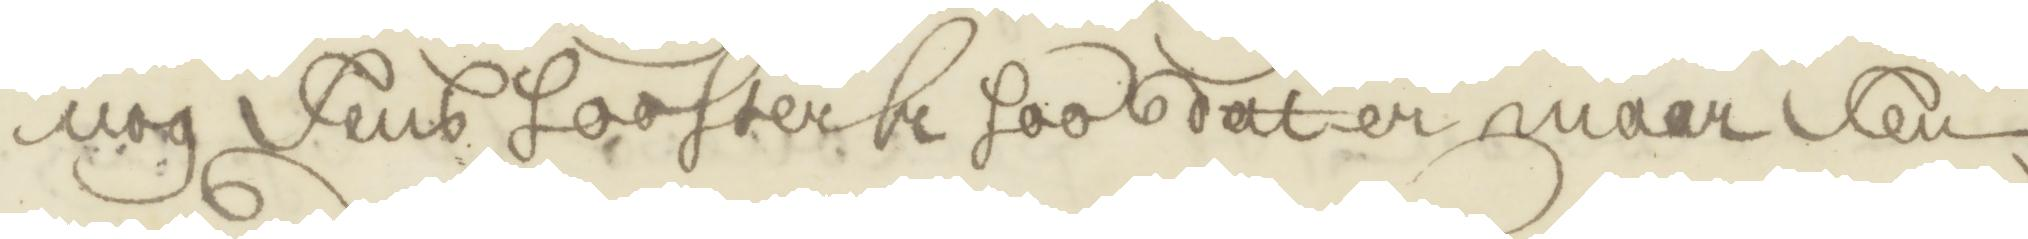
nog Eens soo sterk soo dat er maar Een
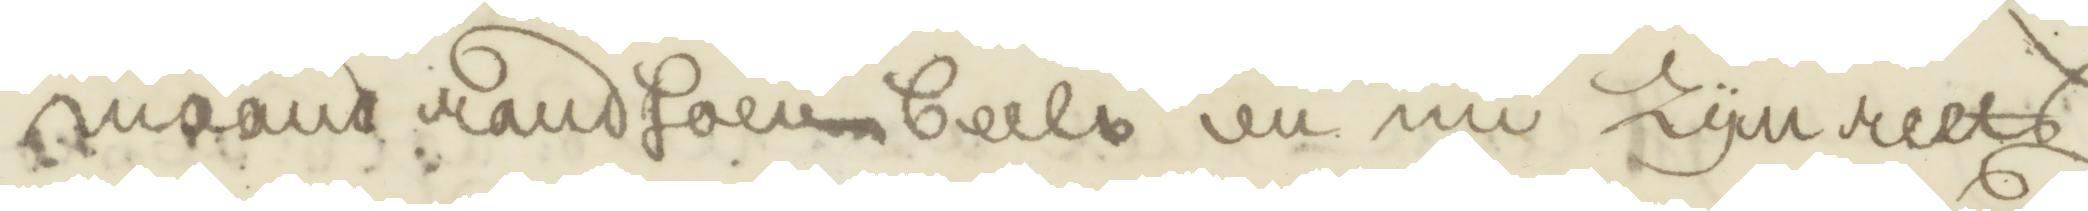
maand randsoen bleev en nu zijn reets
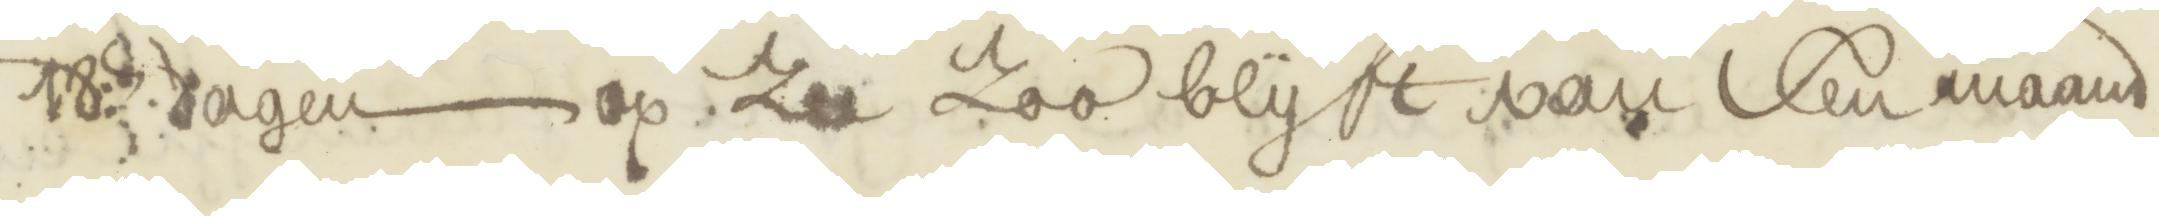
18:' dagen op zee zoo blijft van Een maand
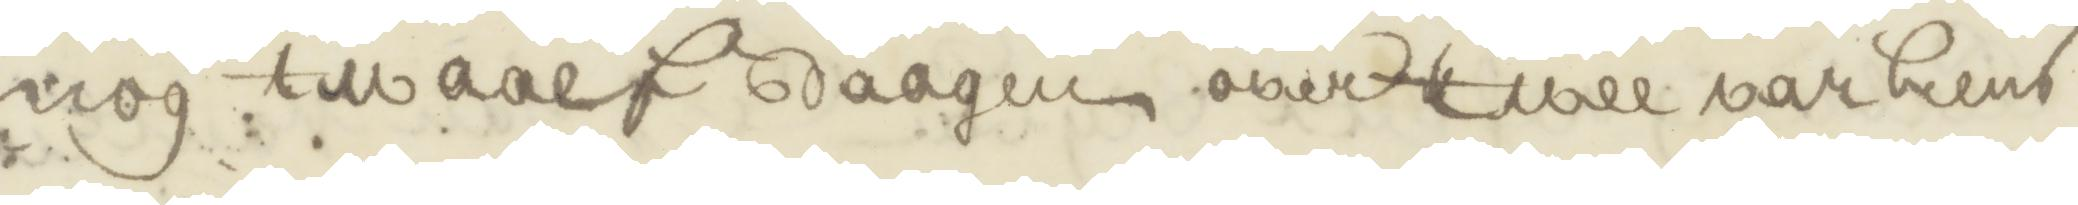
nog twaalf daagen over twee varkens
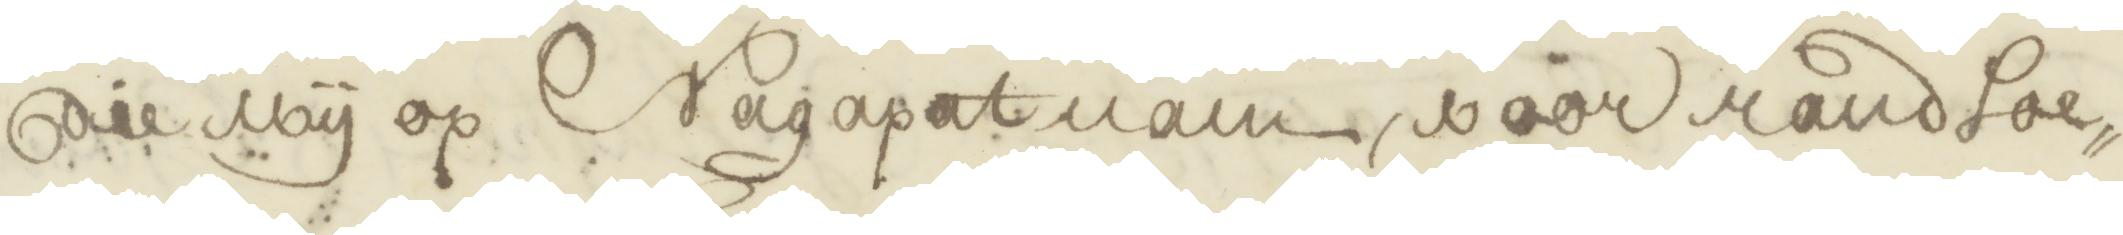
die wij op Nagapatnam, voor randsoe„
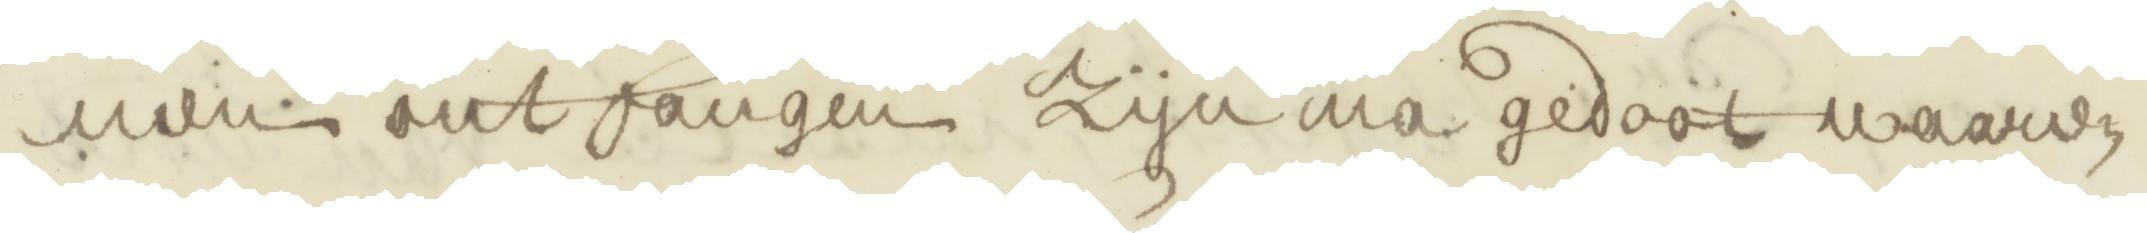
nen ontfangen zijn na gedoot waaren
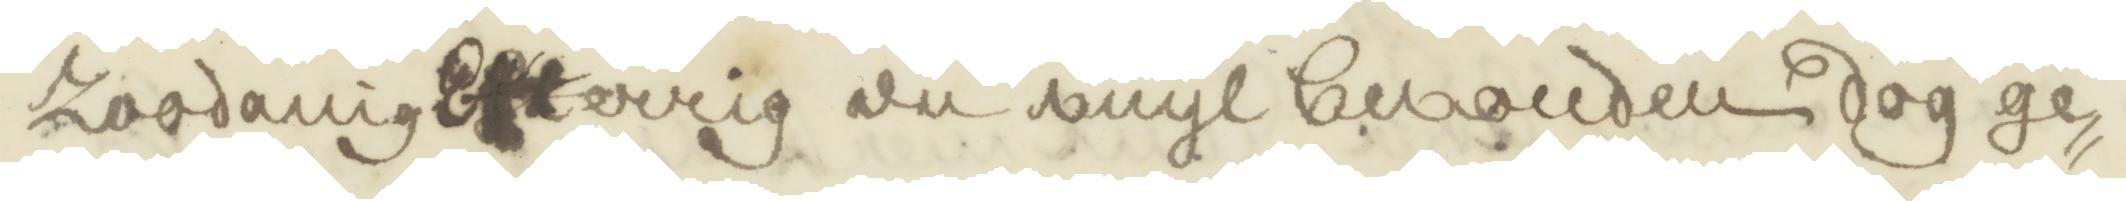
zoodanig Etterrig en vuijl bevonden dog ge„
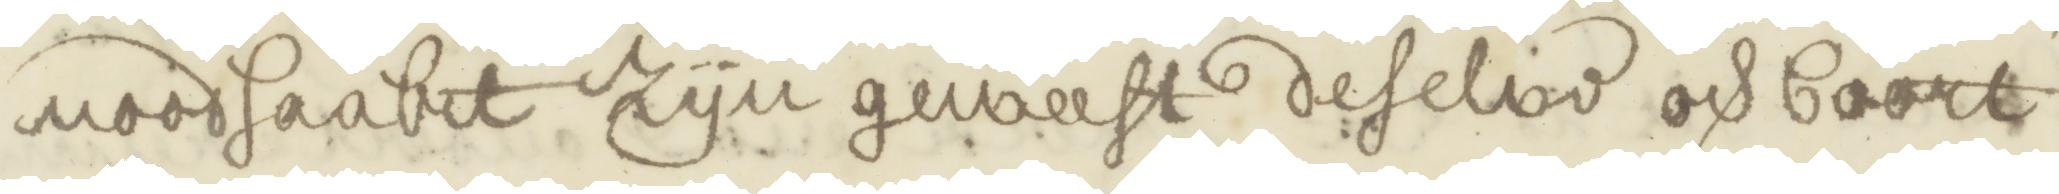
noodsaakt zijn geweest deselve over boort
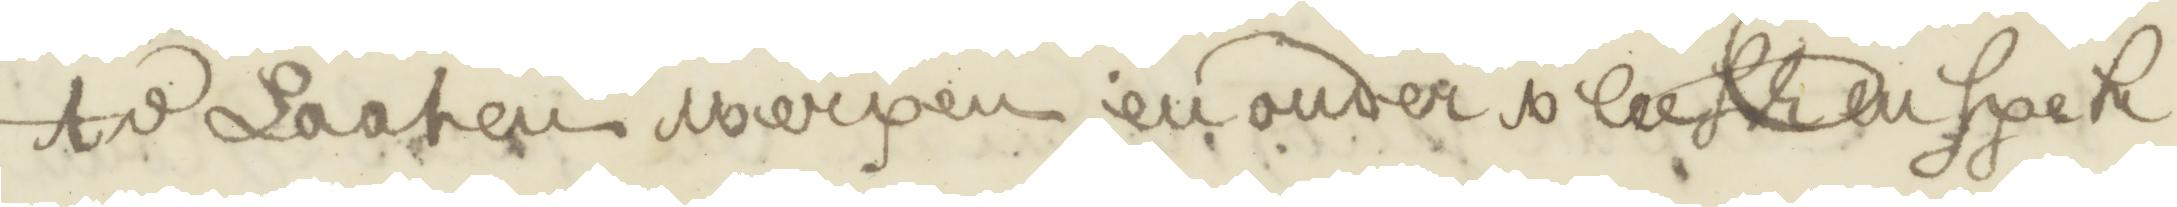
te laaten werpen en onder vleesch en spek
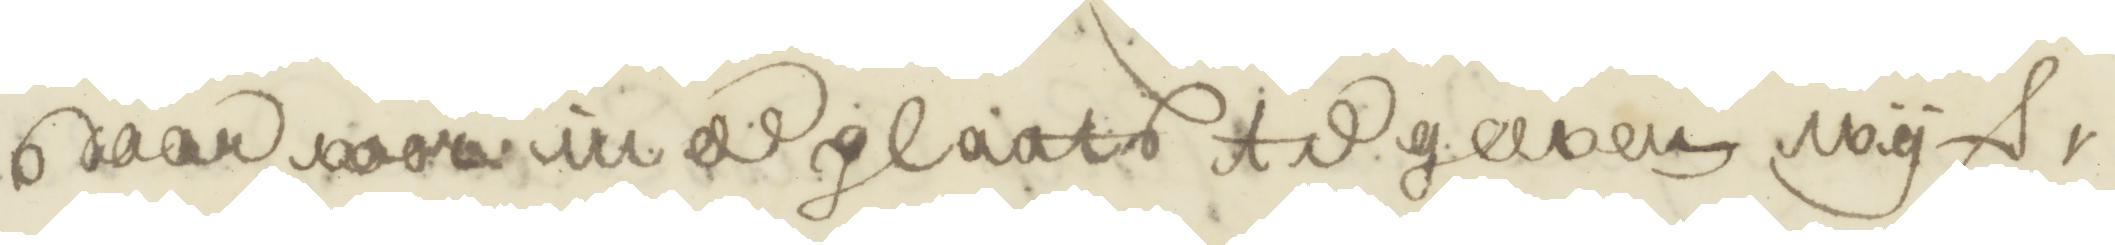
daar voor in de plaats te geeven wij ver„
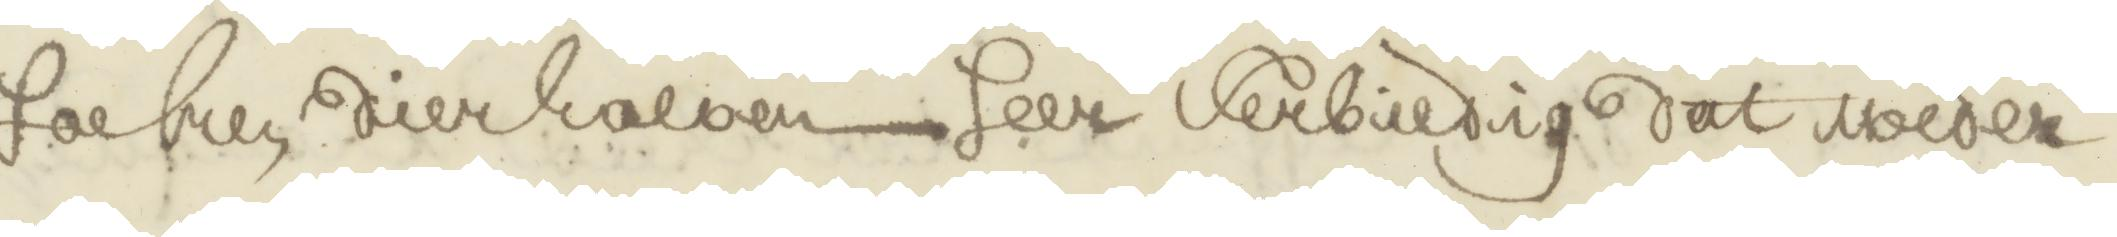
soeken dierhalven seer Eerbiedig dat weder
